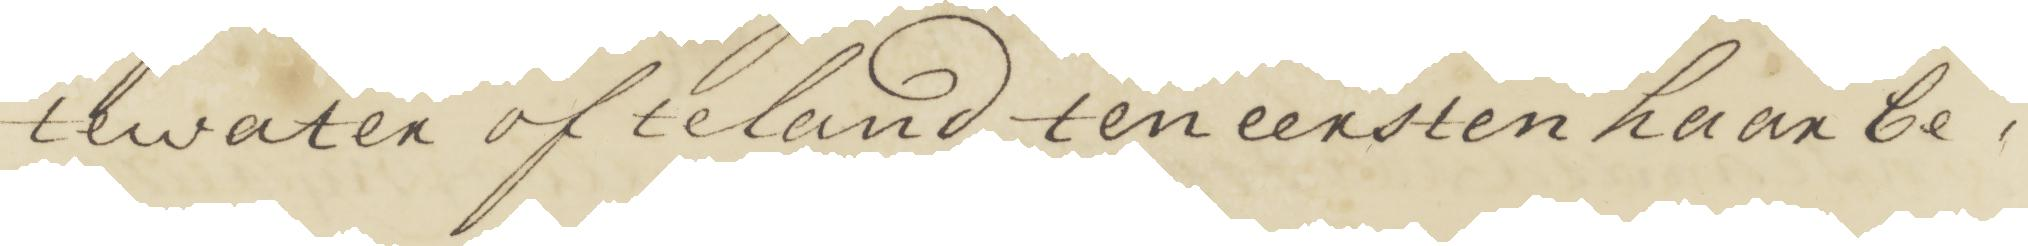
tewater of te land ten eersten haar be„
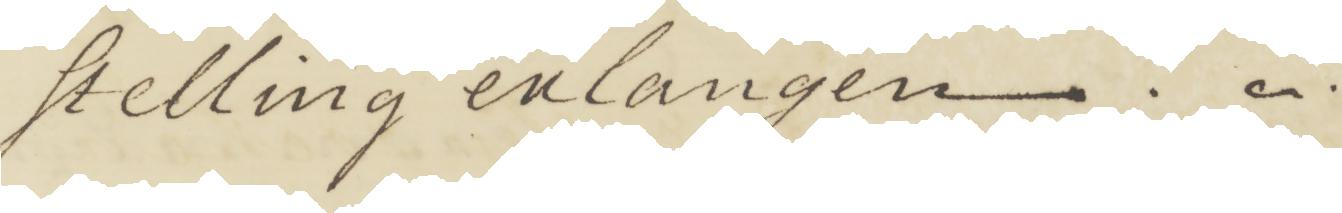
stelling erlangen. —.
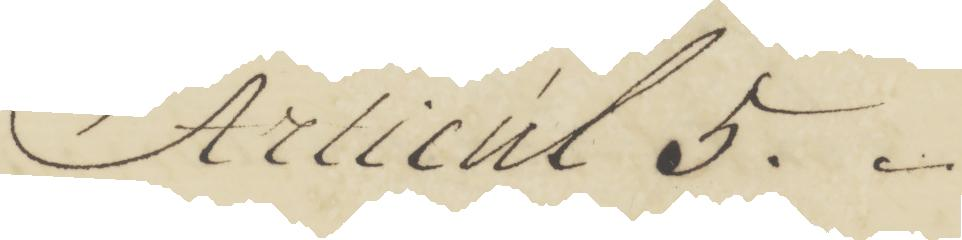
Articul 5. —
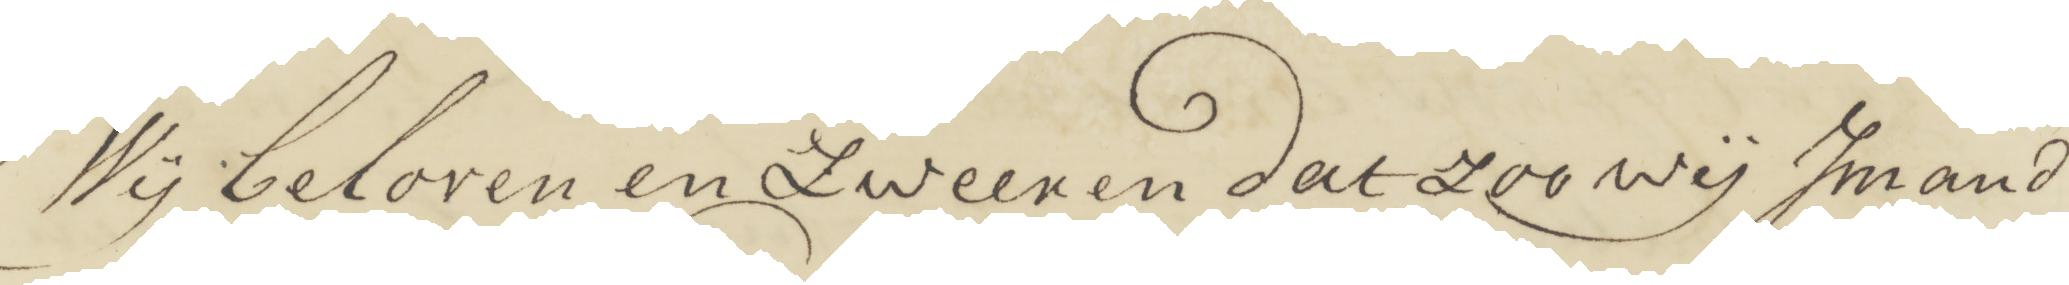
Wij beloven en Zweeren dat zoo wij Jmand
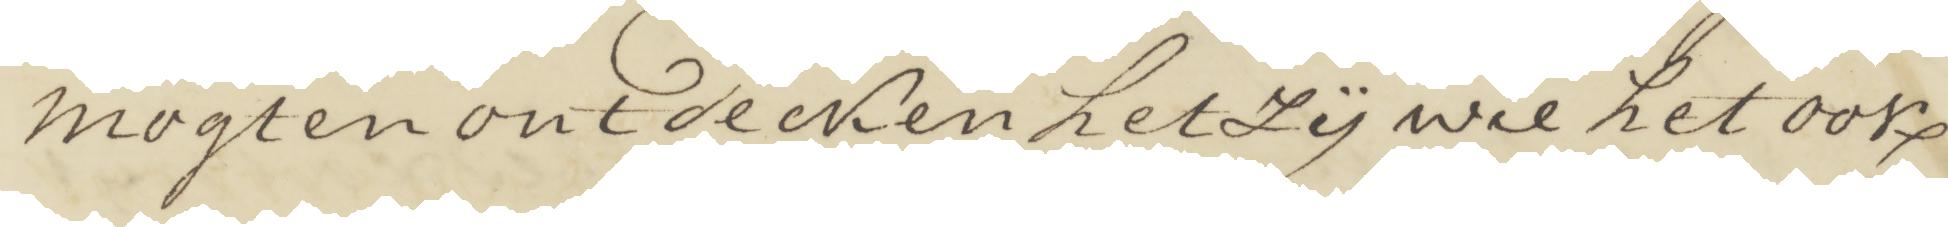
mogten ontdecken het zij wie het ook
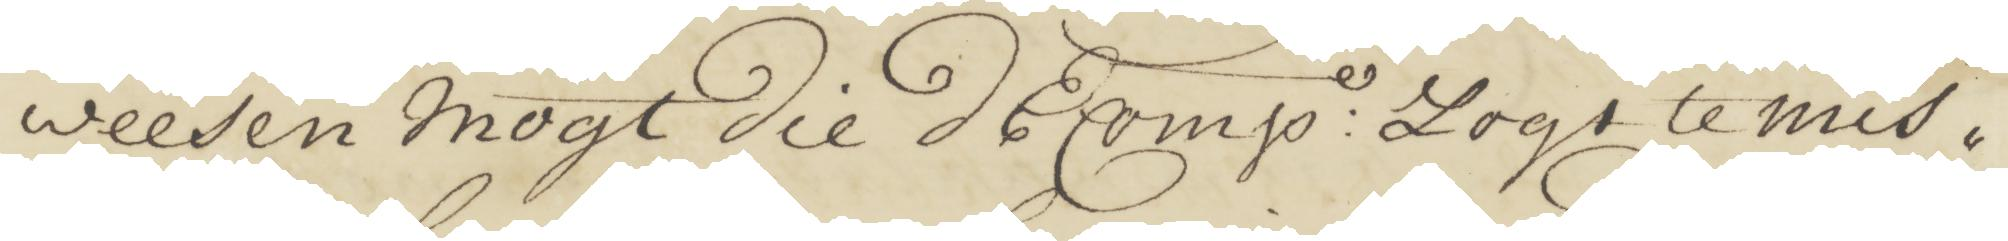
weesen Mogt die d EComp:e Zogt te mis„
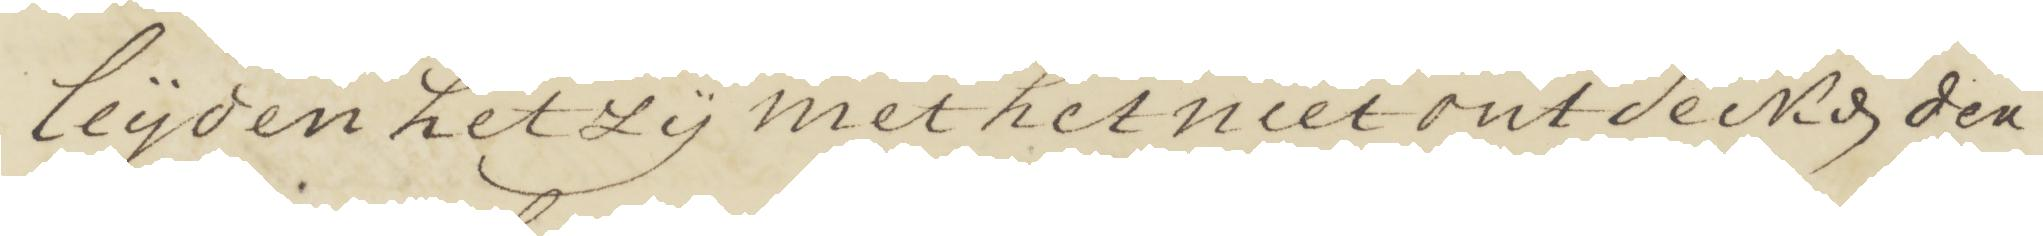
leijden het zij met het niet ontdecken der
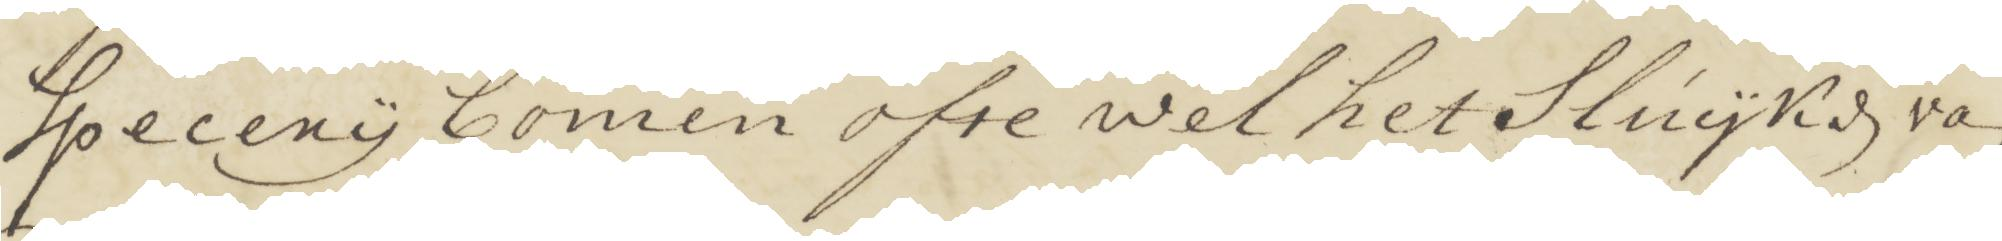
specerij bomen ofte wel het Sluijken van
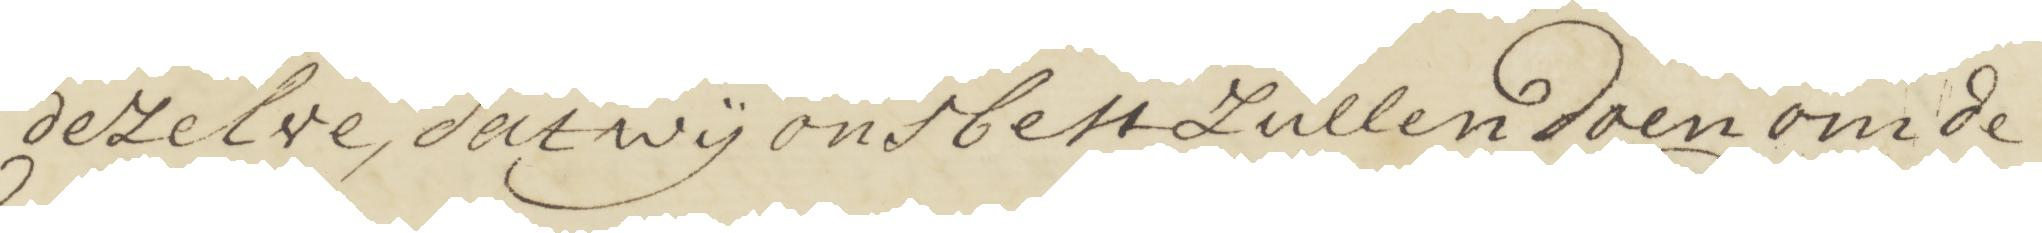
dezelve, dat wij ons best Zullen doen om de
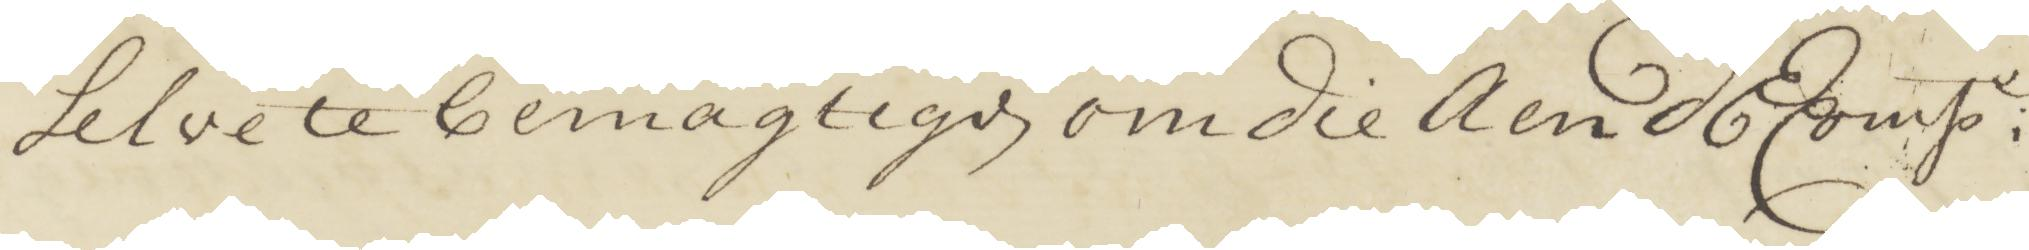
Selve te bemagtigen om die Aen d'EComp:e
